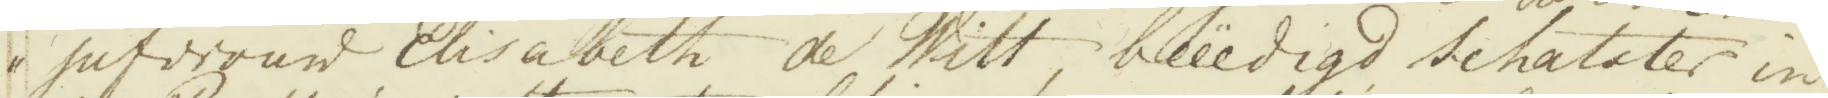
„jufvrouw Elisabeth de Witt, beëedigd schatster in
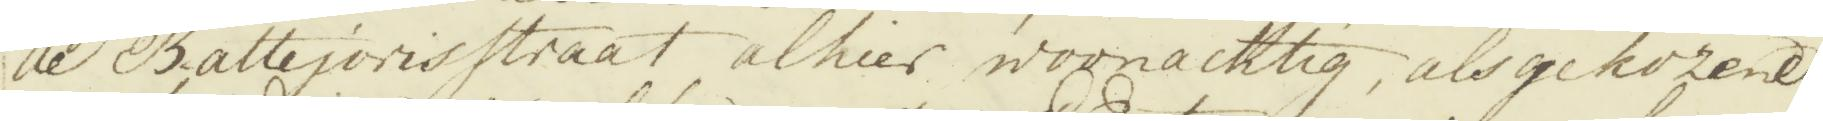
de Battejorisstraat alhier woonachtig, als gekozene
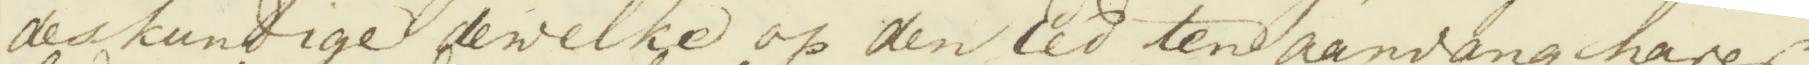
deskundige dewelke op den Eed ten aanvang harer
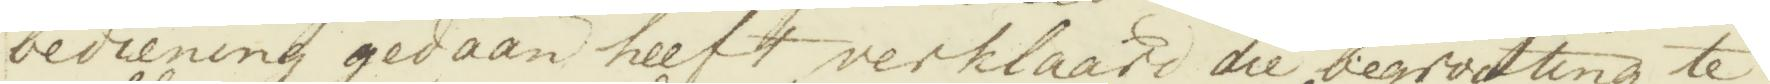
bediening gedaan heeft verklaard die begroeting te
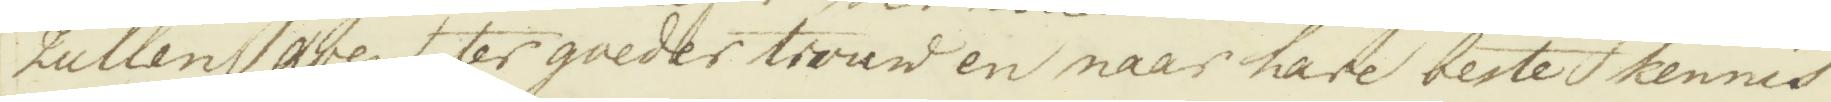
zullen doen ter goeder trouw en naar hare beste kennis
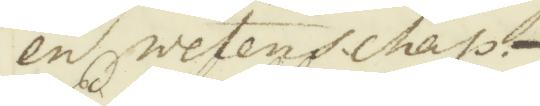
en wetenschap
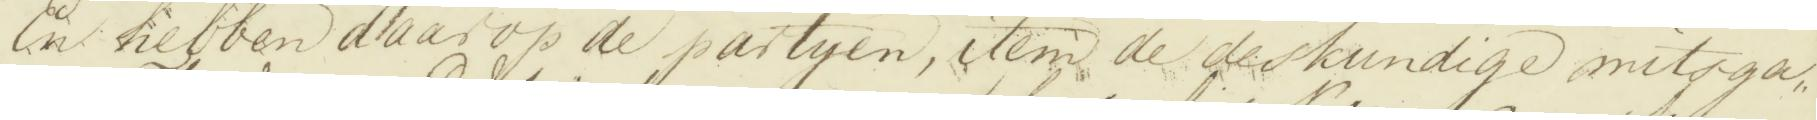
en hebben daar op de partyen, item de deskundige mitsga„
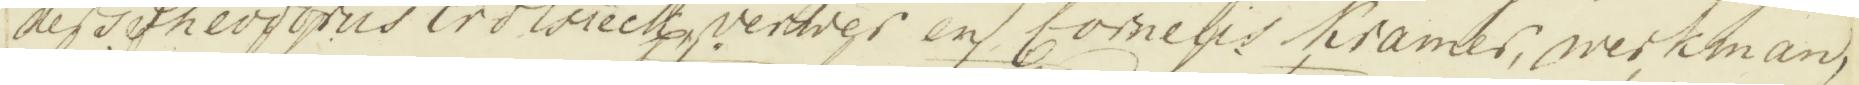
ders Theodorus Erdtsieck, verwer en Cornelis Kramer, werkman,
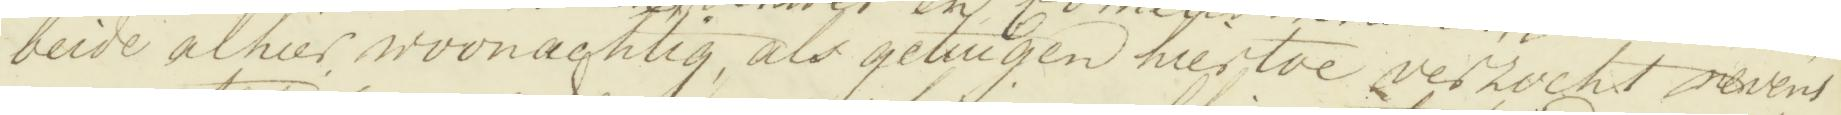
beide alhier, woonachtig als getuigen hier toe verzocht nevens
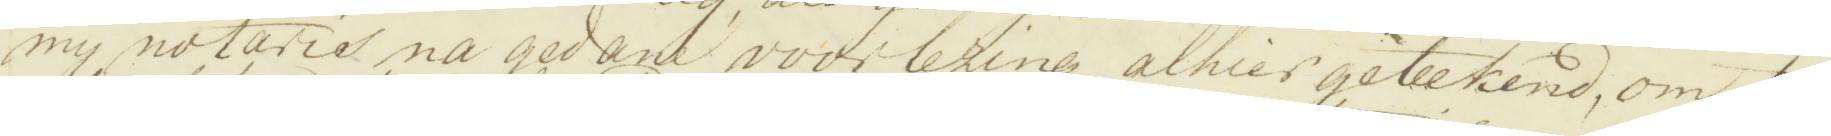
mij notaris na gedane voorlezing alhier geteekend, om te
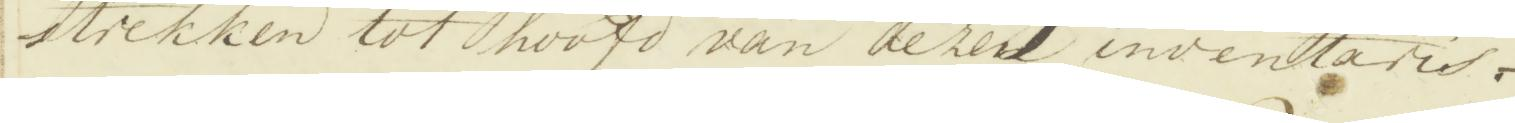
strekken tot hoofd van dezen inventaris.
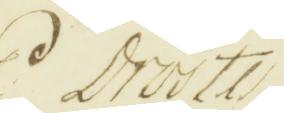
P Droste
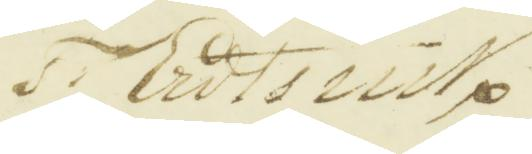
T. Erdsieck
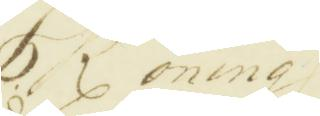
L Koning
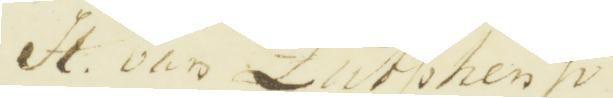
H. van Zutphen Jr
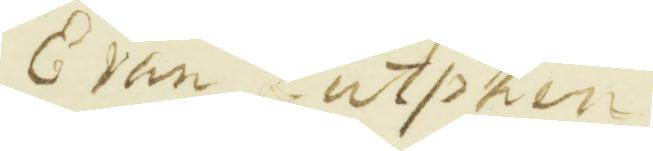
E van Zutphen
